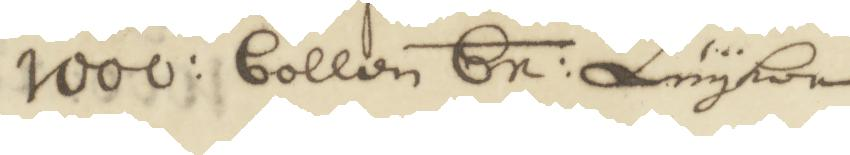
1000: bollen br: zuijker
